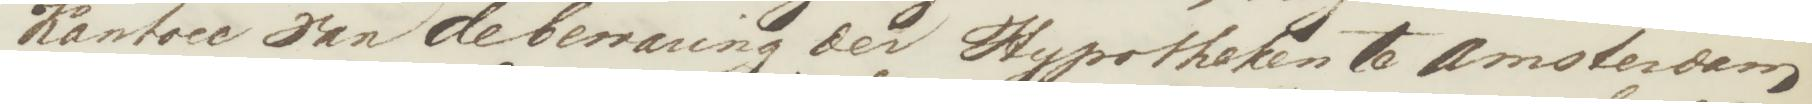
Kantore van de bewaring der Hypotheken te Amsterdam
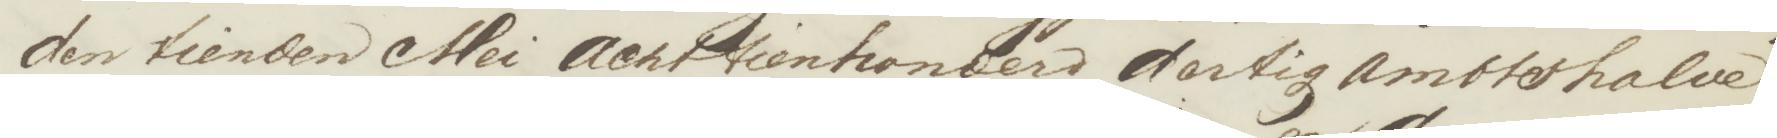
den tienden Mei achttienhonderd dertig ambtshalve
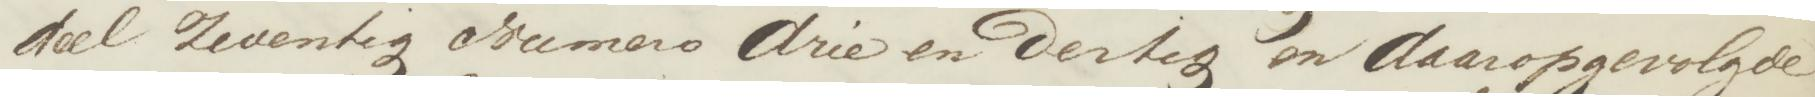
deel zeventig Numero drie en dertig en daaropgevolgde
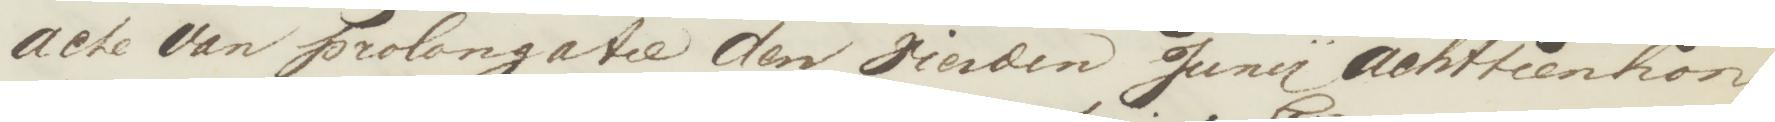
acte van prolongatie den vierden Junij achttienhon
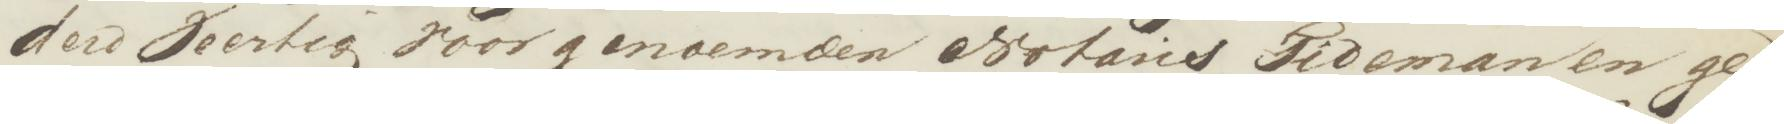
derd Veertig voor genoemden Notaris Tideman en ge
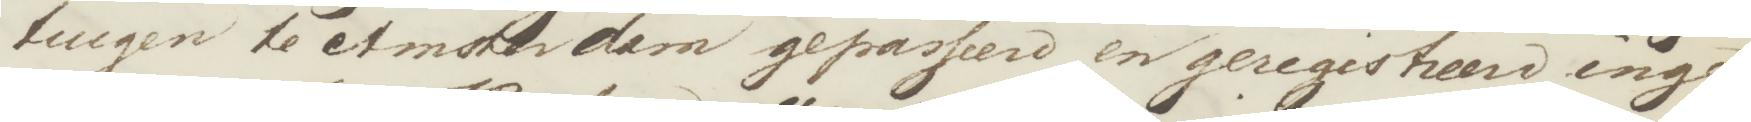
tuigen te Amsterdam gepasseerd en geregistreerd inge
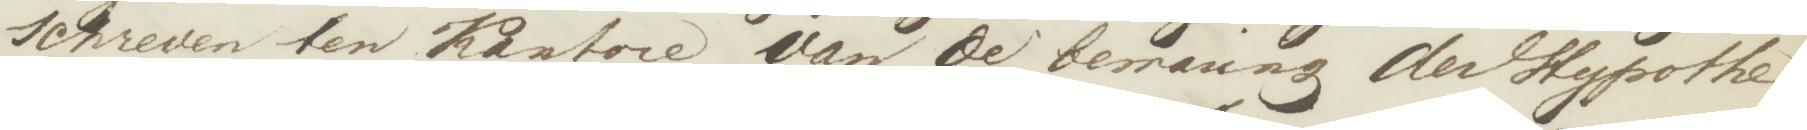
schreven ten Kantore van de bewaring der Hijpothe
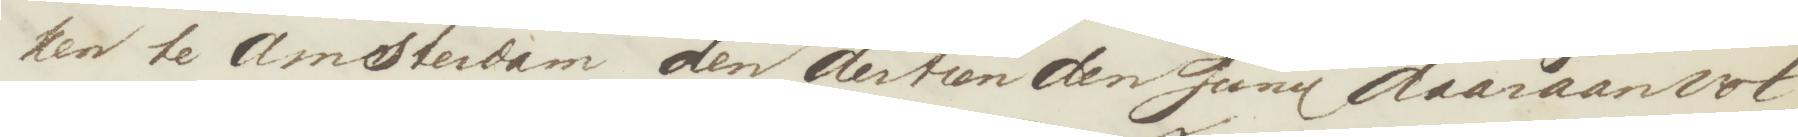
ken te Amsterdam den dertien den Juny daaraanvol
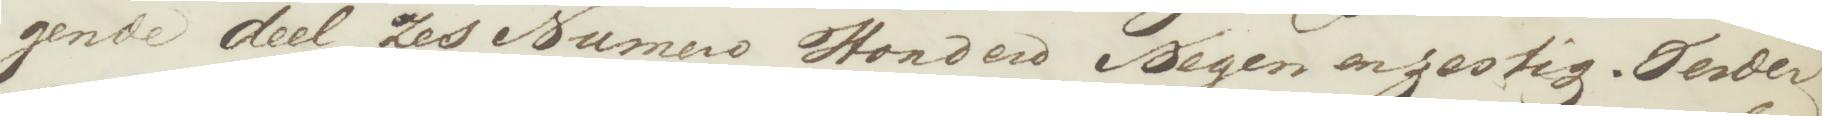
gende deel zes Numero Honderd Negen en zestig. Verder
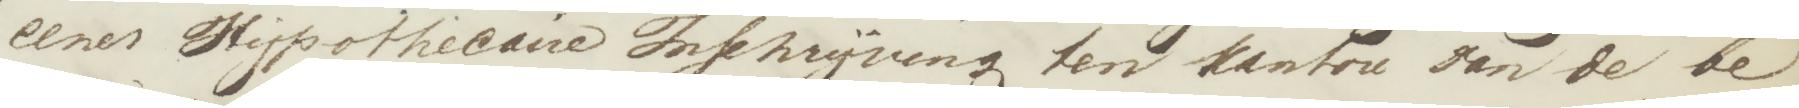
eener Hijpothecaire Inschrijving ten kantore van de be
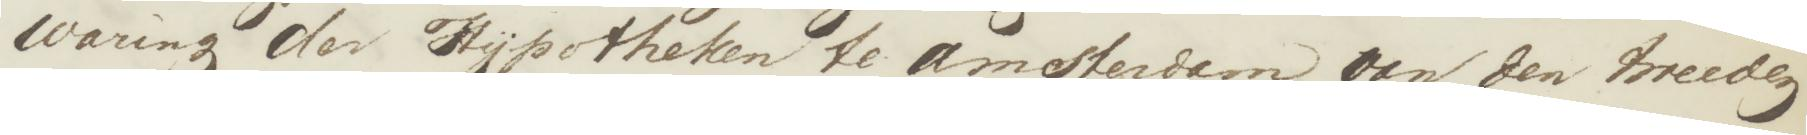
waring der Hijpotheken te Amsterdam van den tweeden
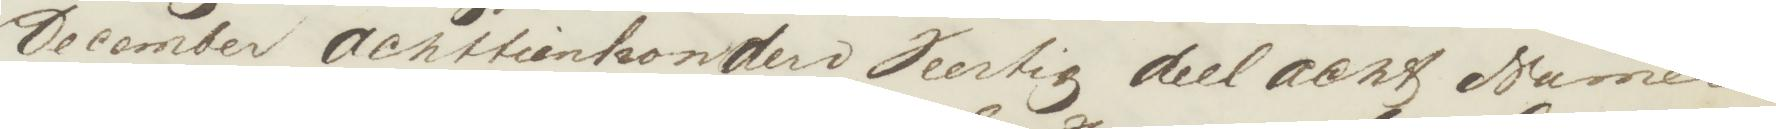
December achttienhonderd Veertig deel acht Numero
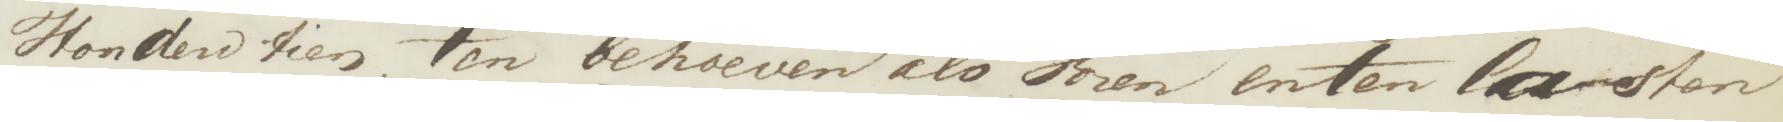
Honderd tien, ten behoeven als voren en ten lasten
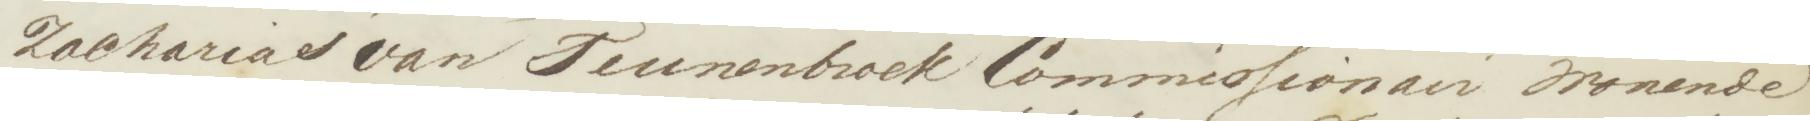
zacharias van Teunenbroek Commissionair wonende
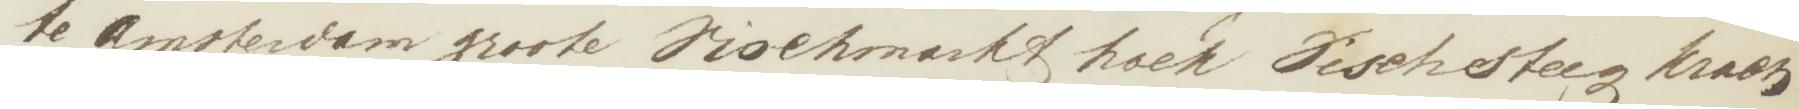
te Amsterdam groote vischmarkt hoek vischsteeg krach
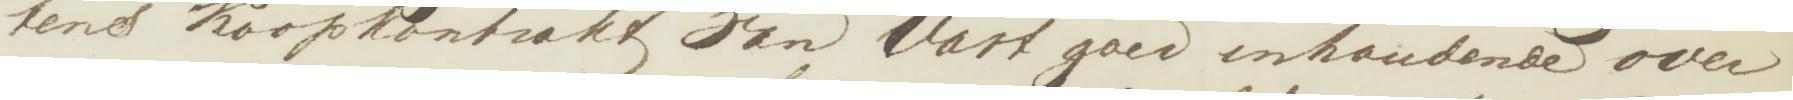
tens Koopkontrakt van Vast goed inhoudende over
